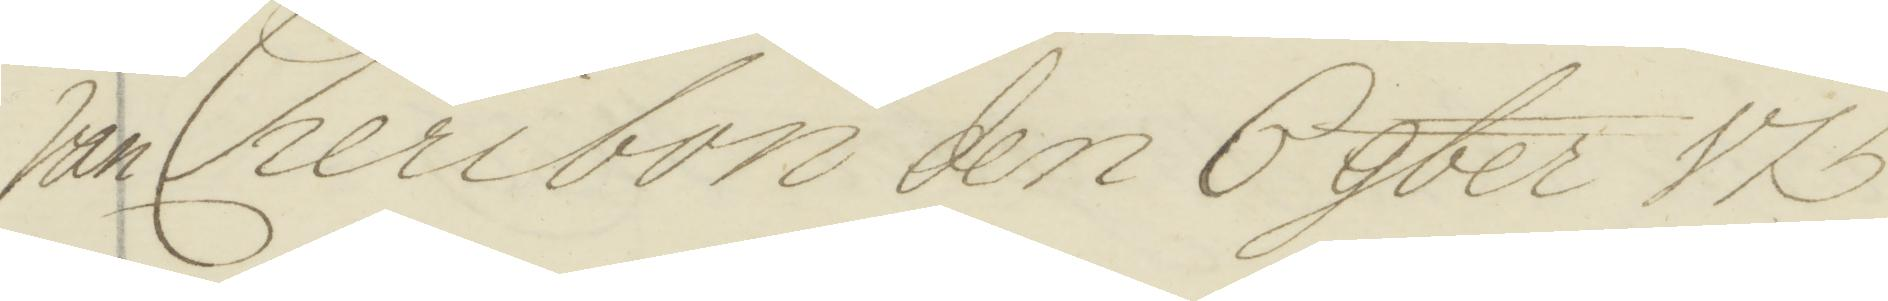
Van Cheribon den 6 9ber 1759.
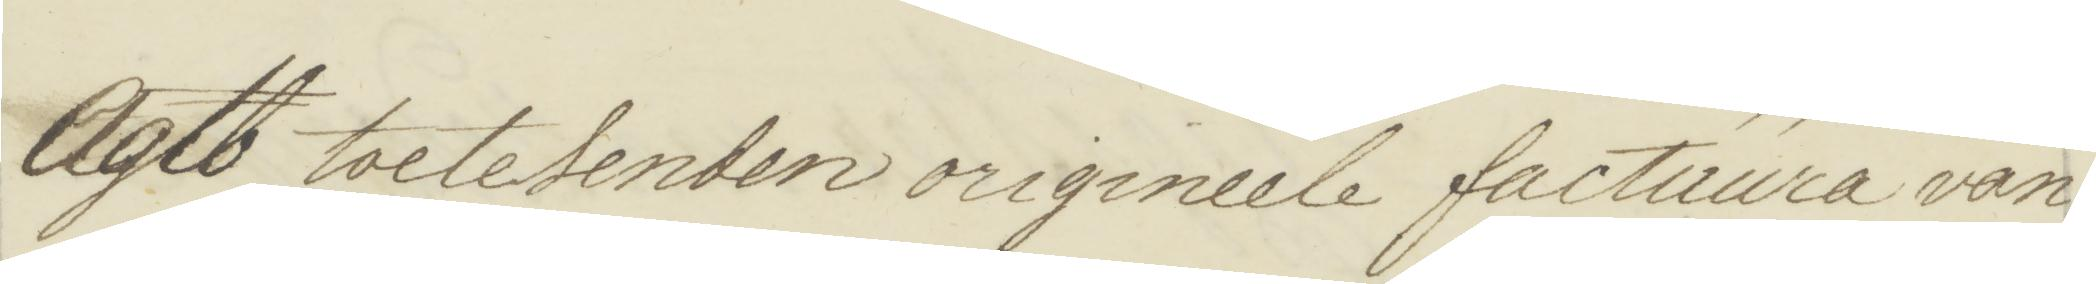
Agtb toetesenden origineele factuura van
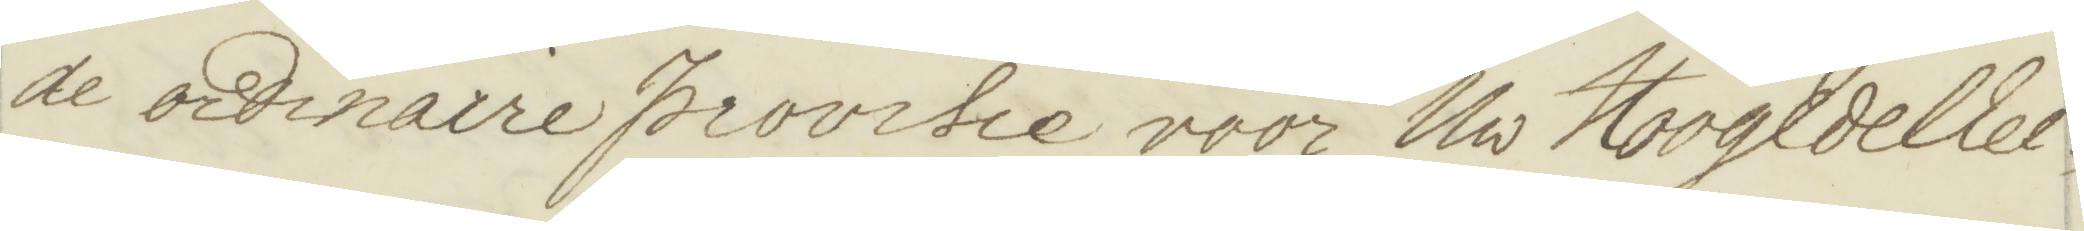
de ordinaire provisie voor Uw Hoog Edelhee=
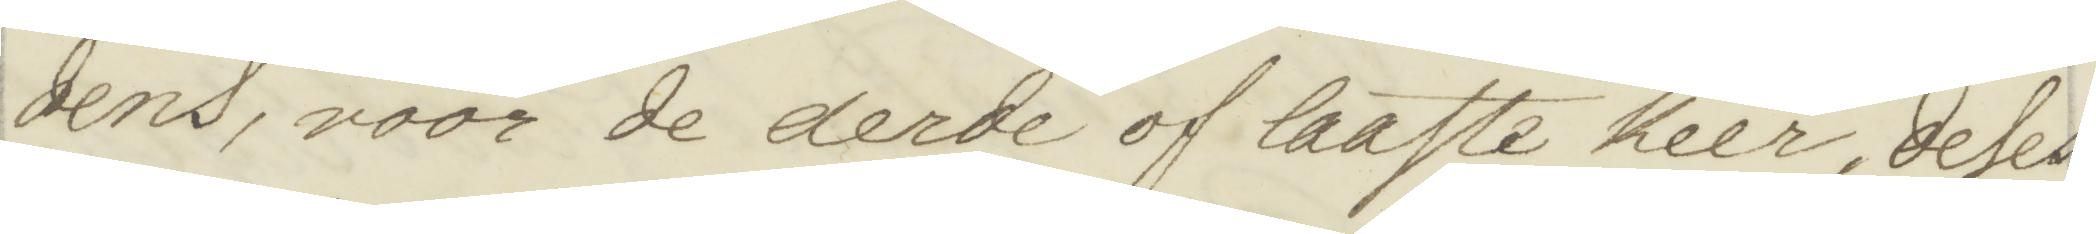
dens, voor de derde of laaste keer, deses
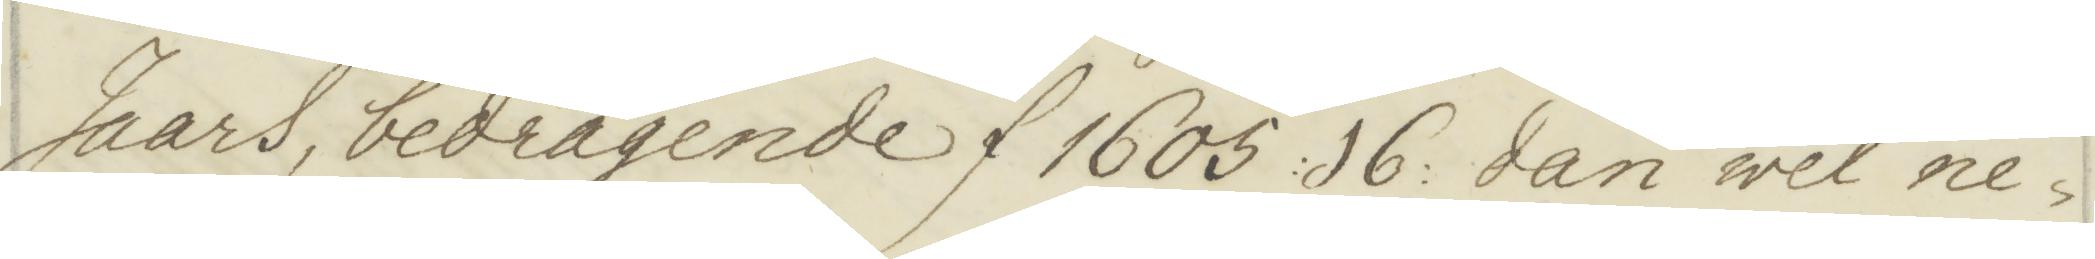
Jaars, bedragende ƒ 1605: 16: dan wel ne=
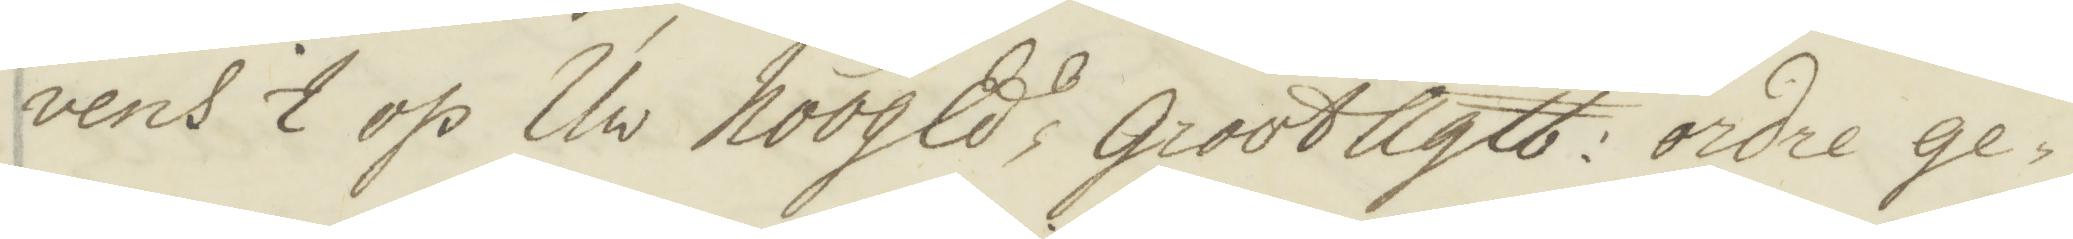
vens 't op Uw hoog Ed„s groot Agtb: ordre ge=
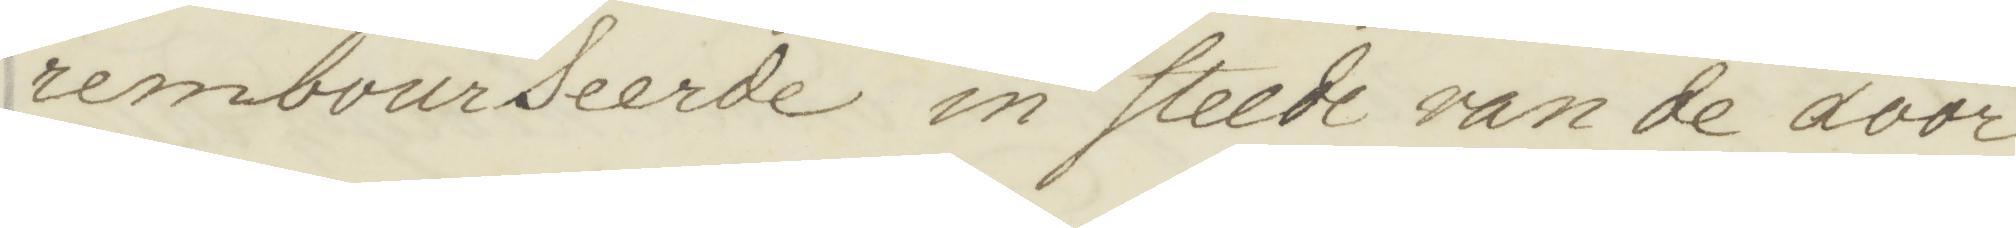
rembourseerde in steede van de door
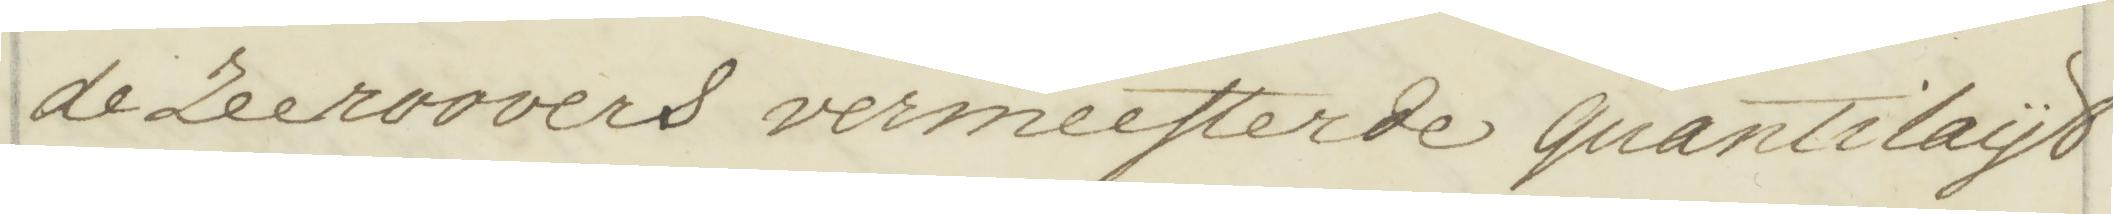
de zeeroovers vermeesterde quantiteijt
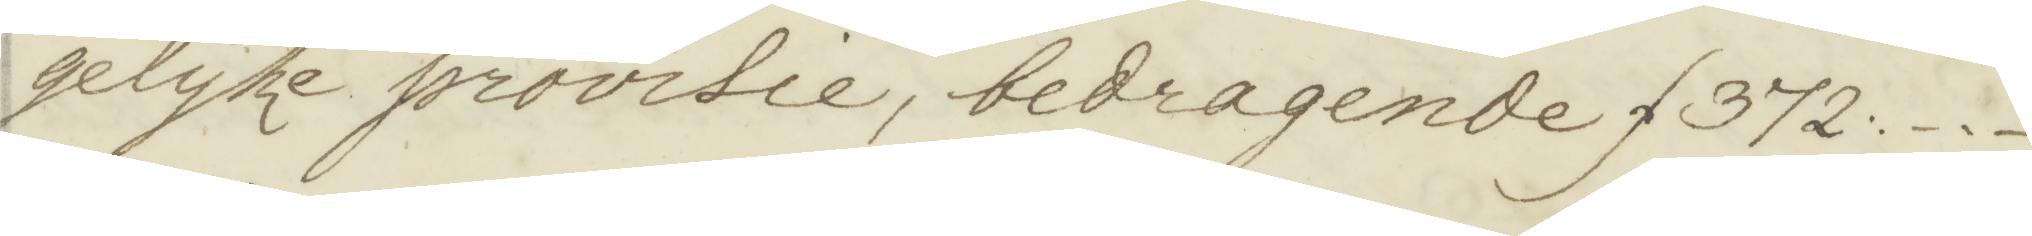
gelijke provisie, bedragende ƒ372: – : –
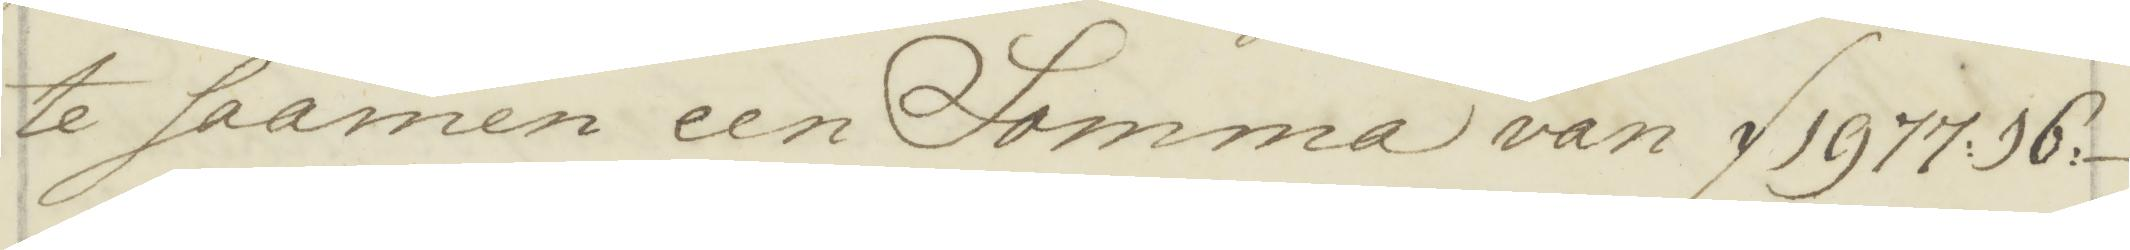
te saamen een Somma van ƒ1977:16:–
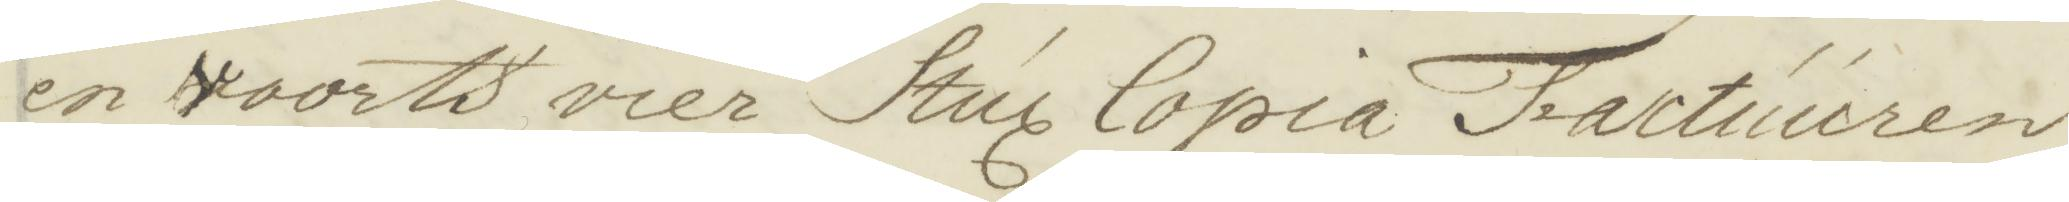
en voorts vier stux Copia Factuuren
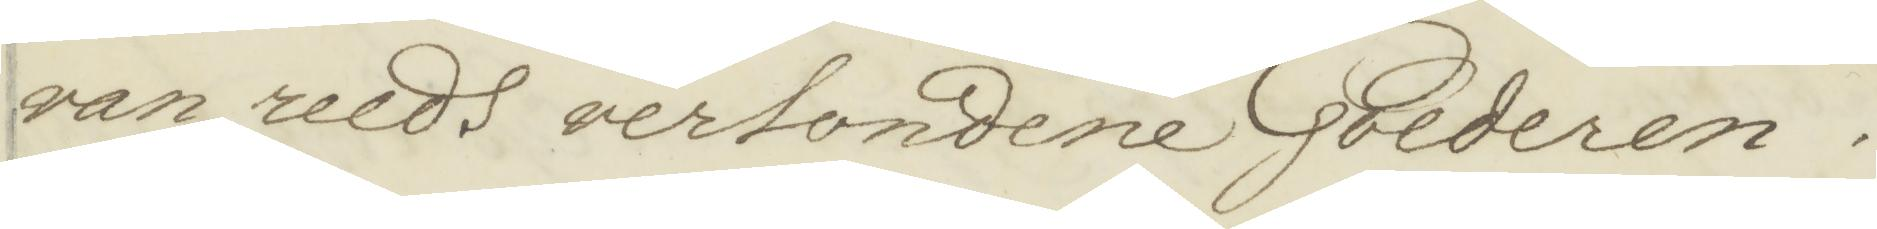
van reeds versondene Goederen.
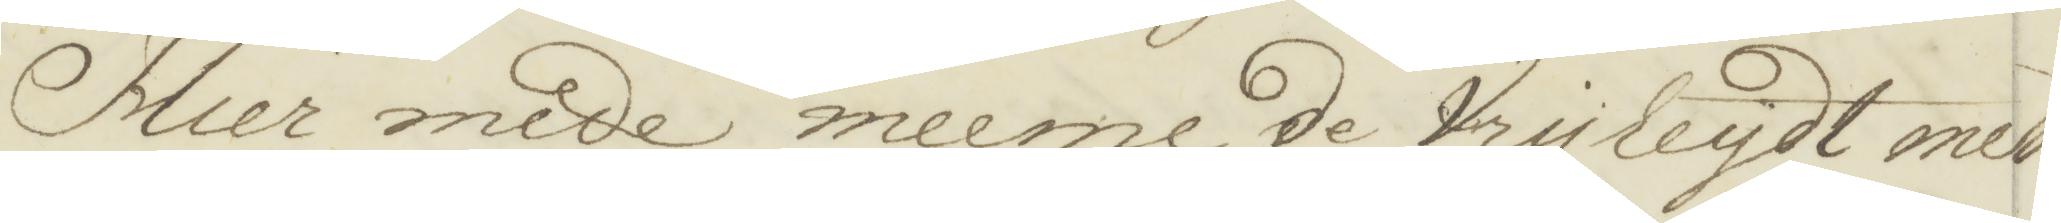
Hier mede meeme de Vrijheijdt met
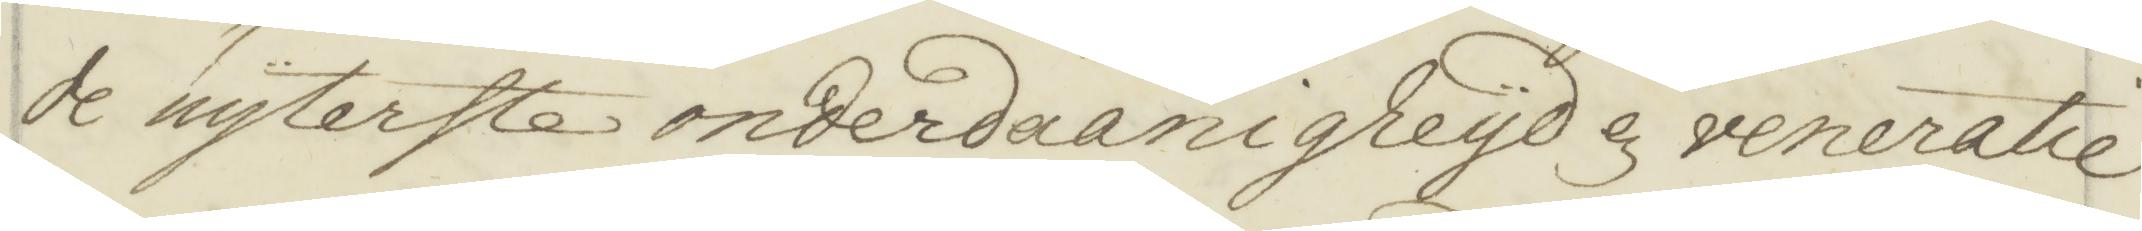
de uijterste onderdaanigheijd en veneratie
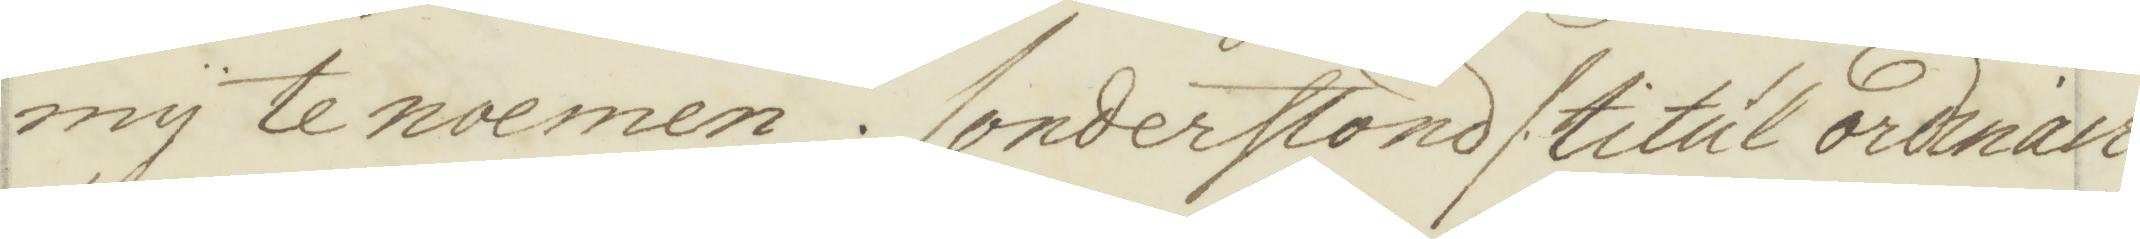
mij te noemen . /onderstond/. titul ordinair
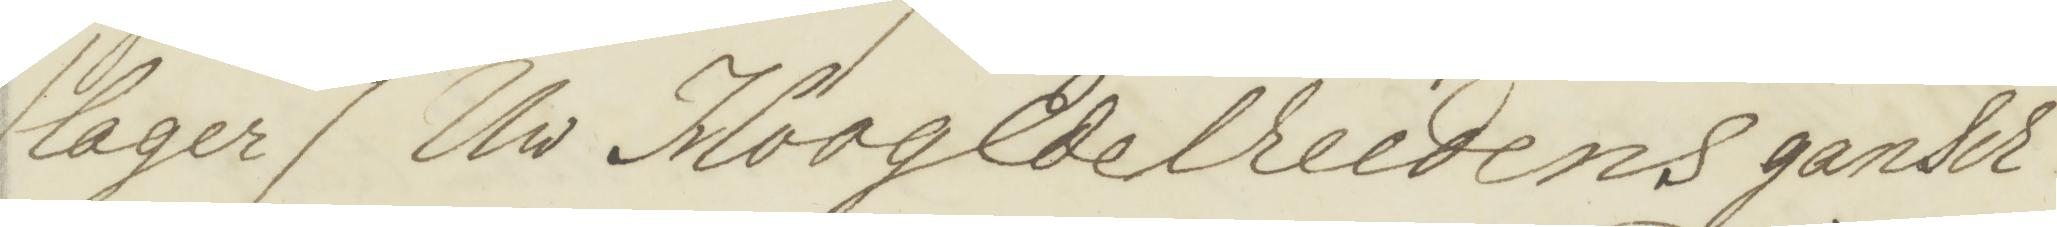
/lager/ Uw Hoog Edelheedens gansch
